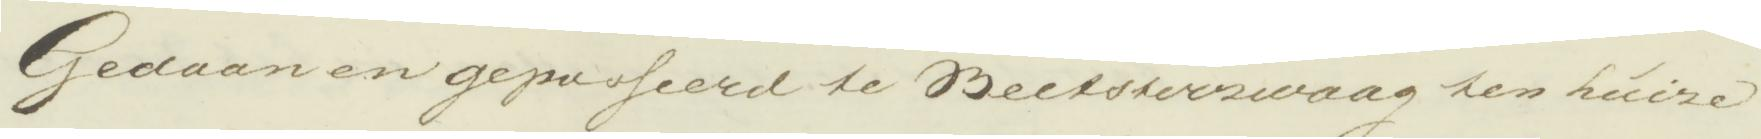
Gedaan en gepasseerd te Beetsterzwaag ten huize
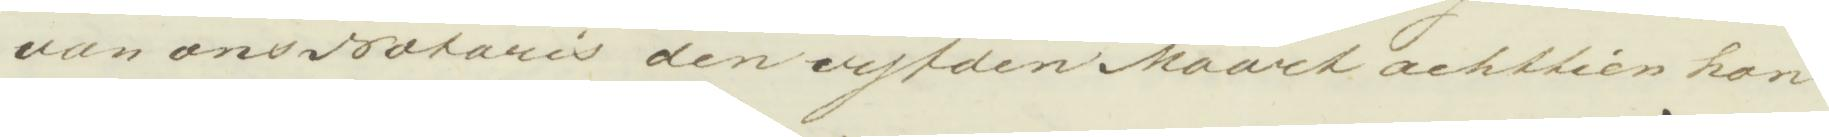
van ons Notaris den vyfden Maart achttien hon
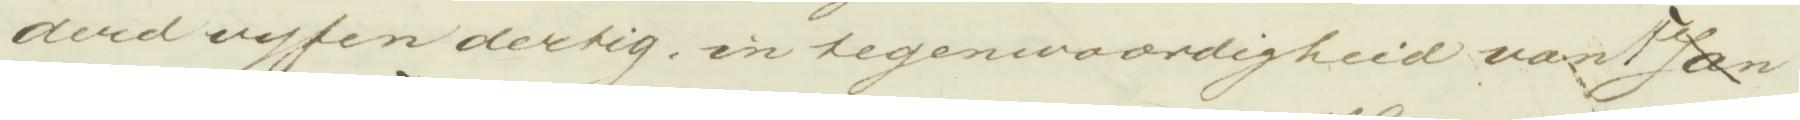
derd vyfen dertig, in tegenwoordigheid van ¶ Jan
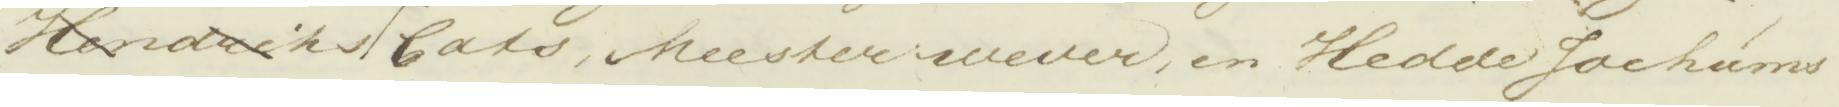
Hendriks ¶ Cats, Meester wever, en Hedde Jochums
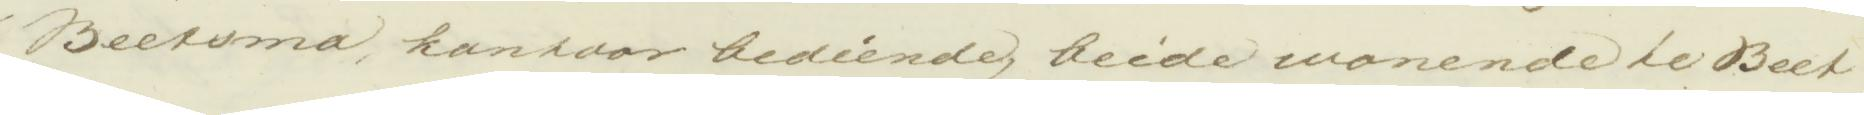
Beetsma, kantoor bediende, beide wonende te Beet
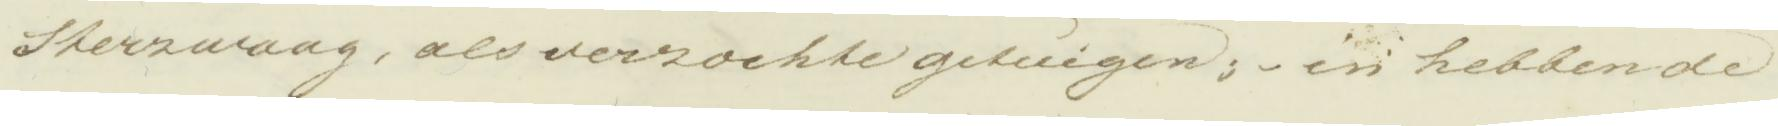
sterzwaag, als verzochte getuigen; - en hebben de
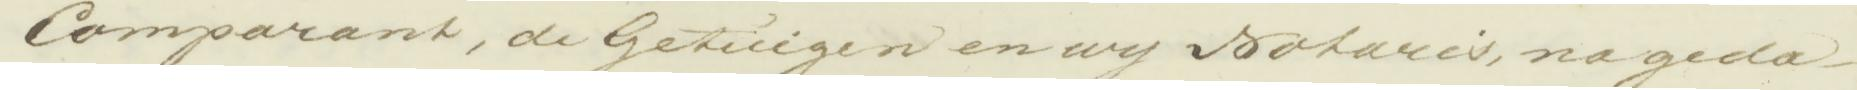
Comparant, de Getuigen en wy Notaris, na geda
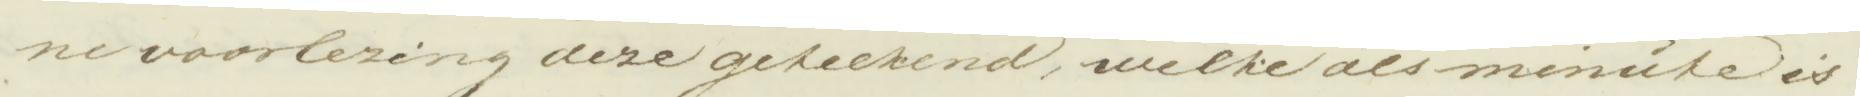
ne voorlezing deze geteekend, welke als minute is
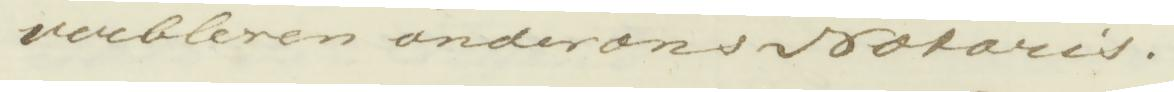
verbleven onder ons Notaris.
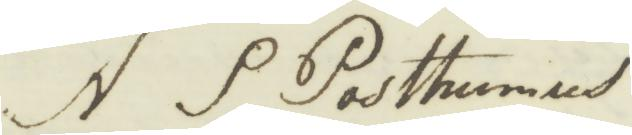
N S Posthumus
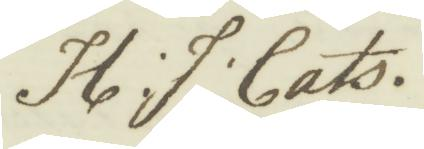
H: J: Cats.
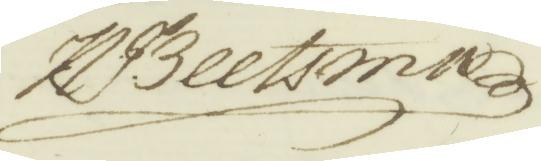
H. J. Beetsma
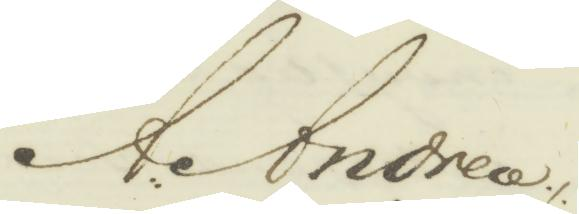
A. Andrea./.
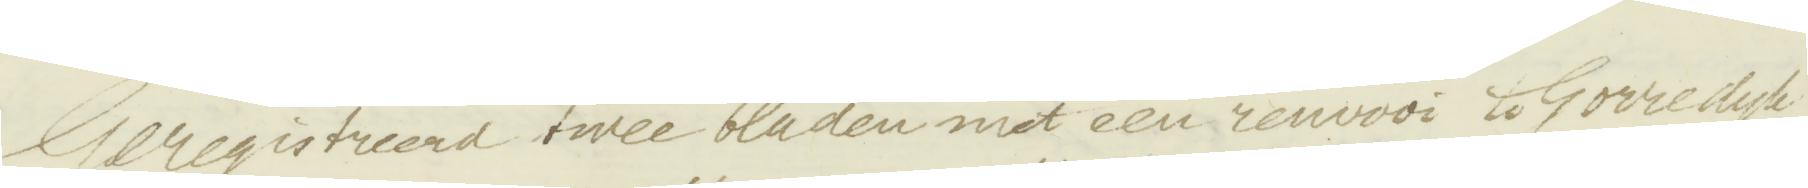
Geregistreerd twee bladen met een renvooi te Gorredyk
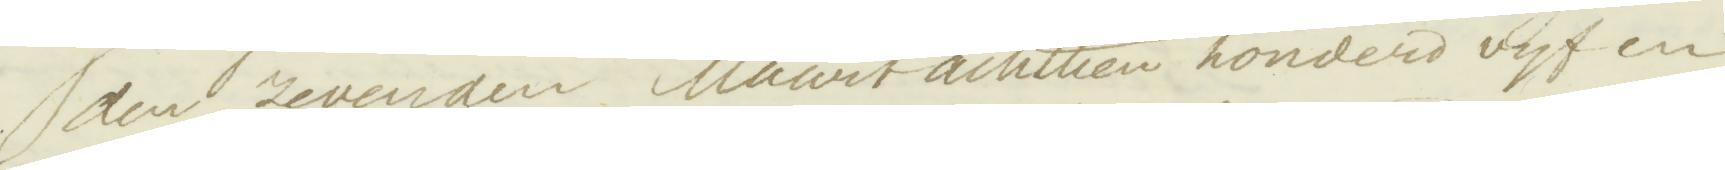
den zevenden Maart achttien honderd vyf en
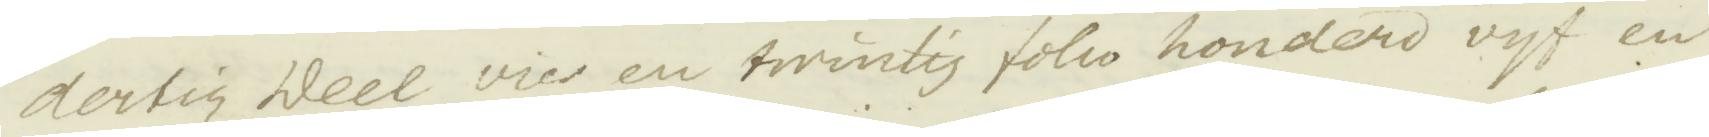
dertig Deel vier en twintig folio honderd vyf en
